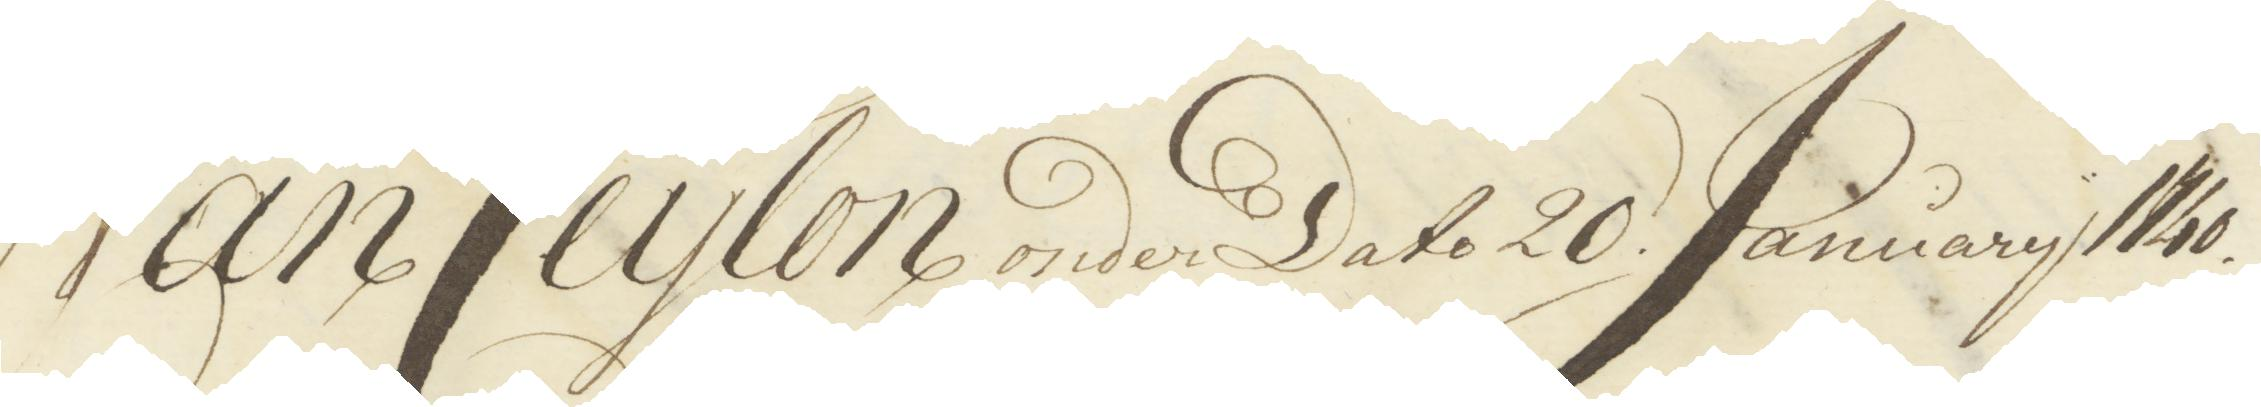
Van Ceijlon onder Dato 20:' January 1740.
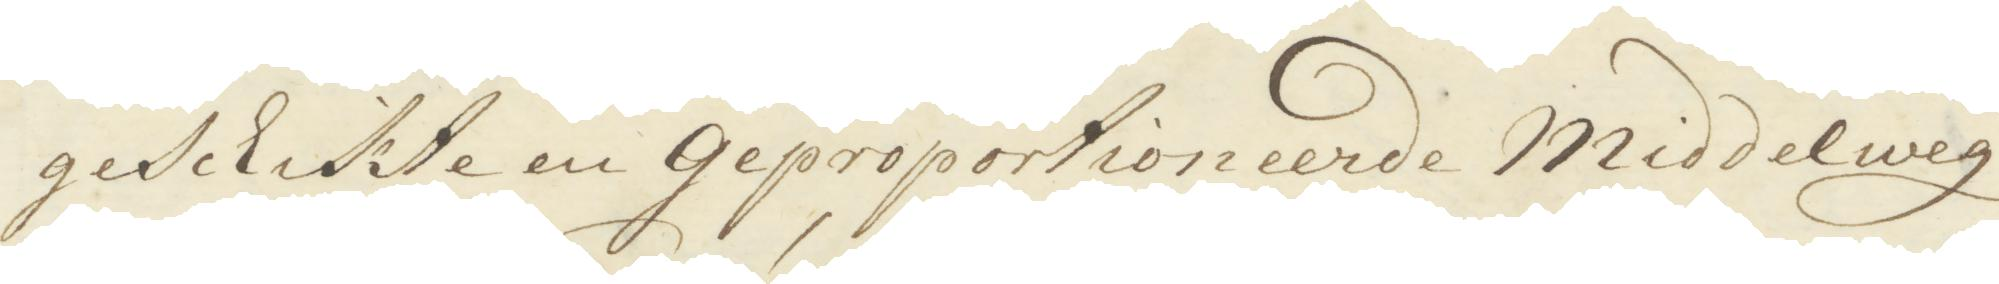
geschikte en geproportioneerde middelweg
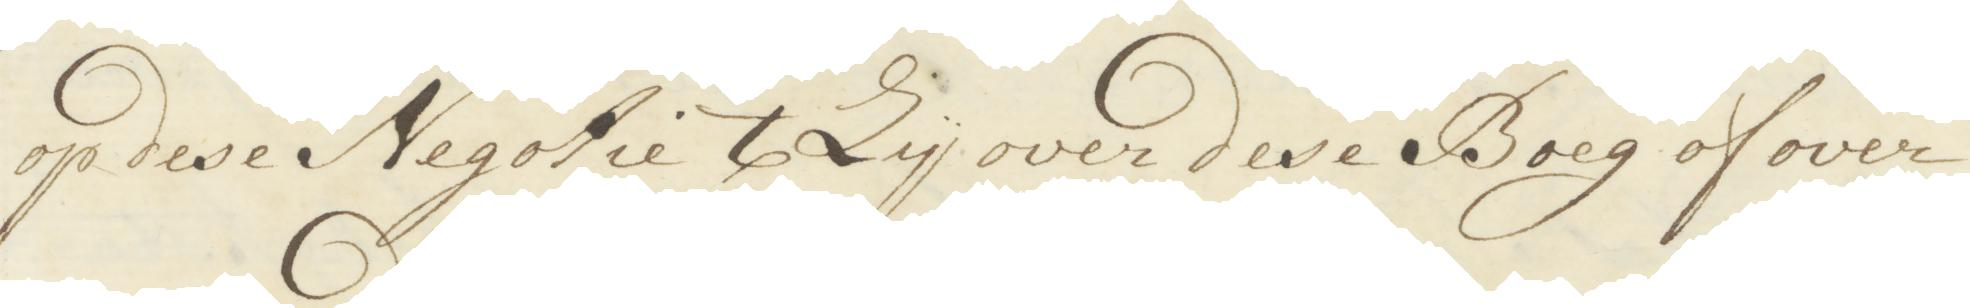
op dese Negotie ’t zij over dese Boeg of over
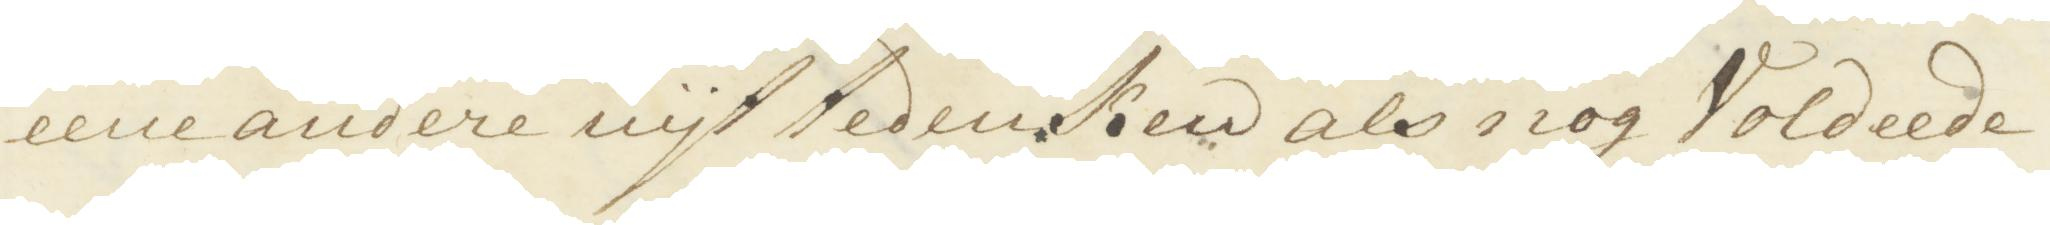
eene andere uijt tedenken als nog Voldeede
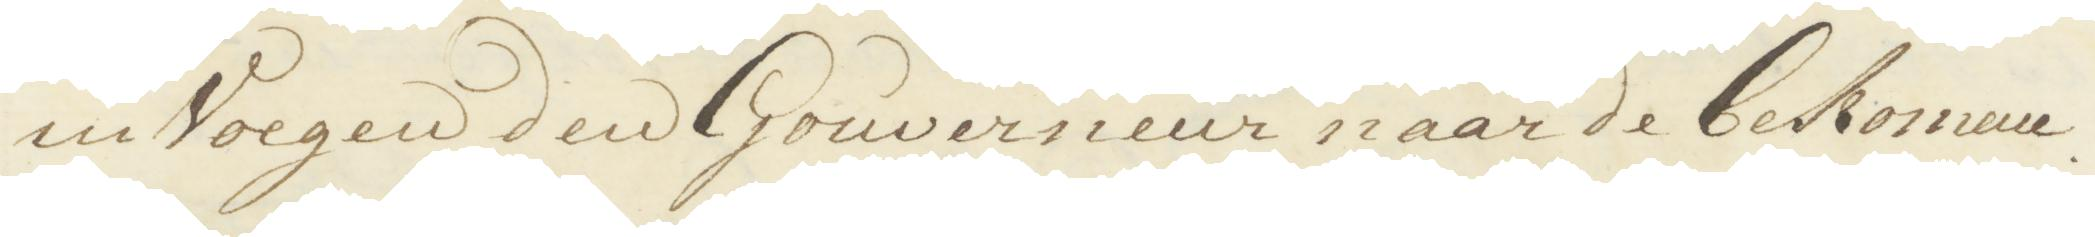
in Voegen den Gouverneur naar de bekomene
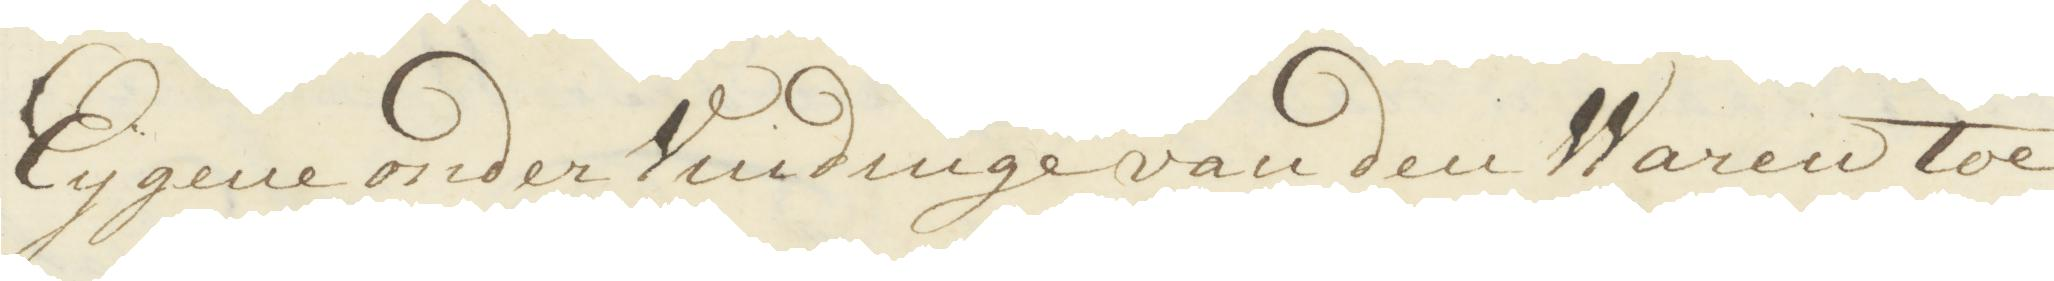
Eijgene onder Vindinge van den Waren toe
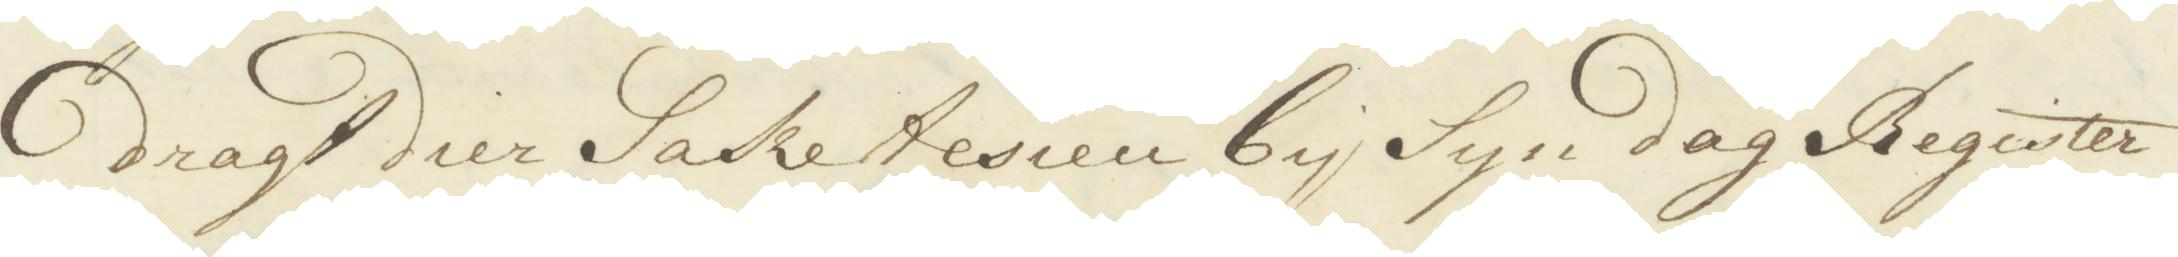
dragt dier sake tesien by syn dag Register
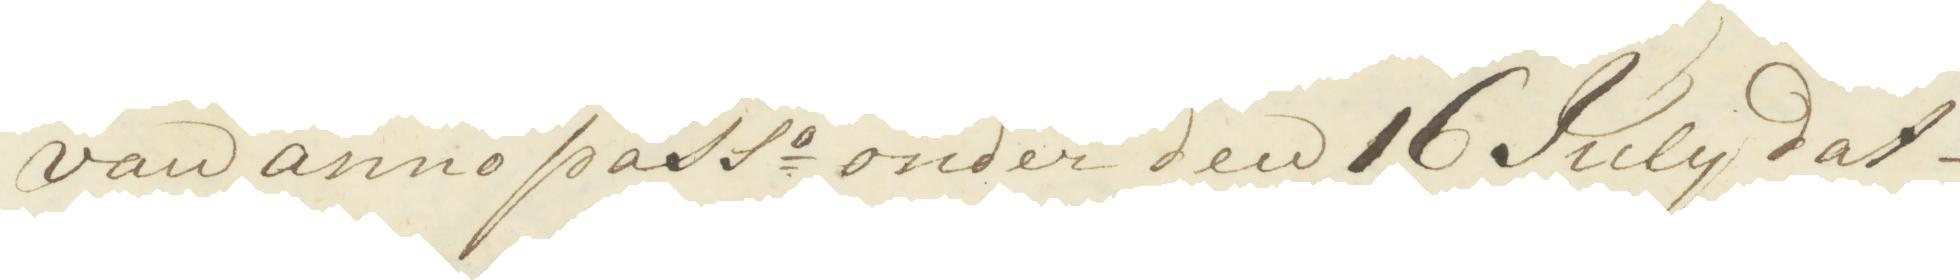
van anno pass=o onder den 16 July dat
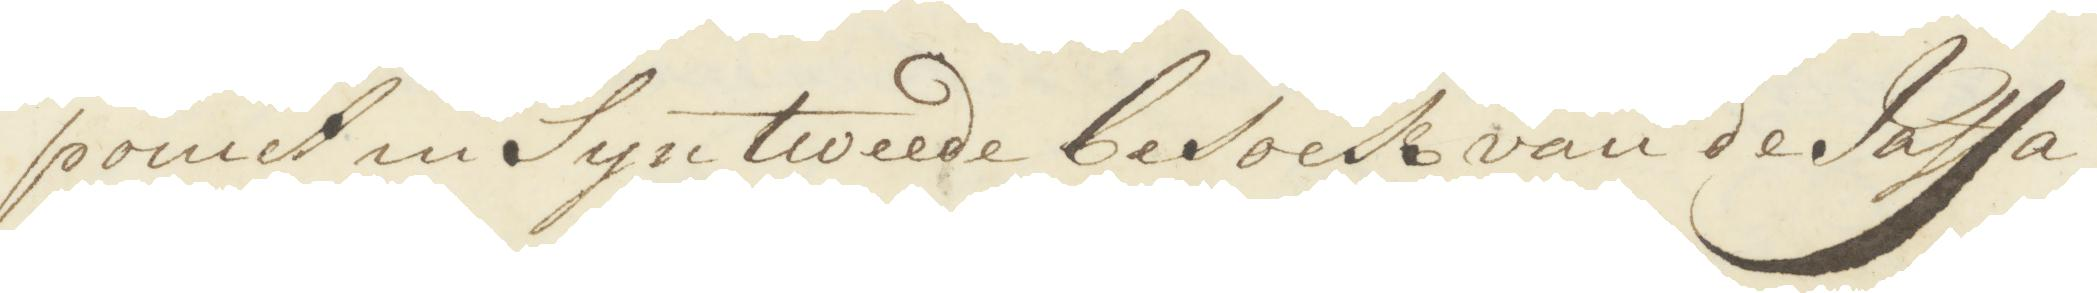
poniet in syn tweede besoek van de Passa
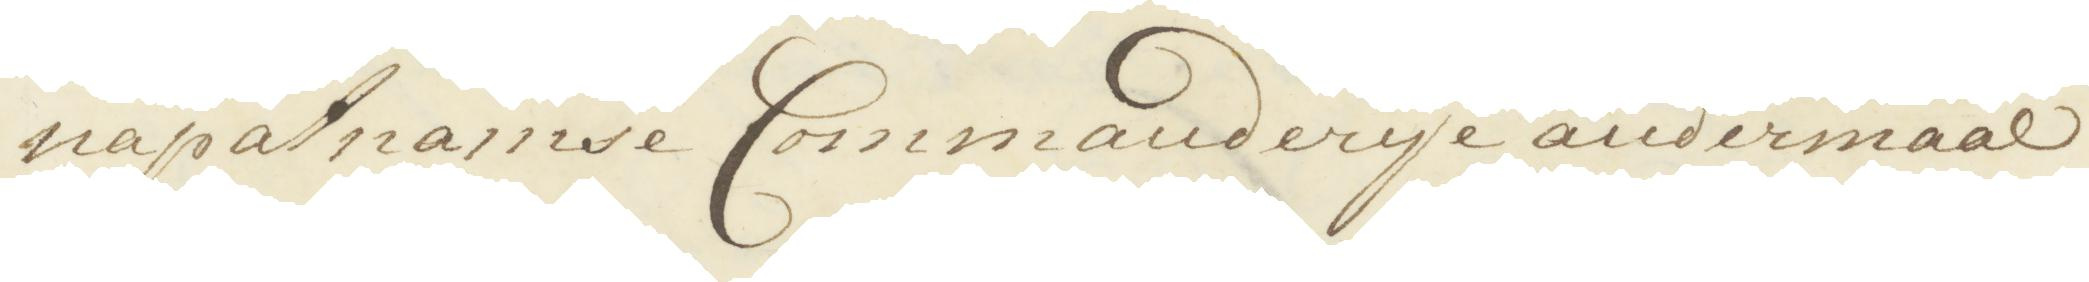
napatnamse Commanderije andermaal
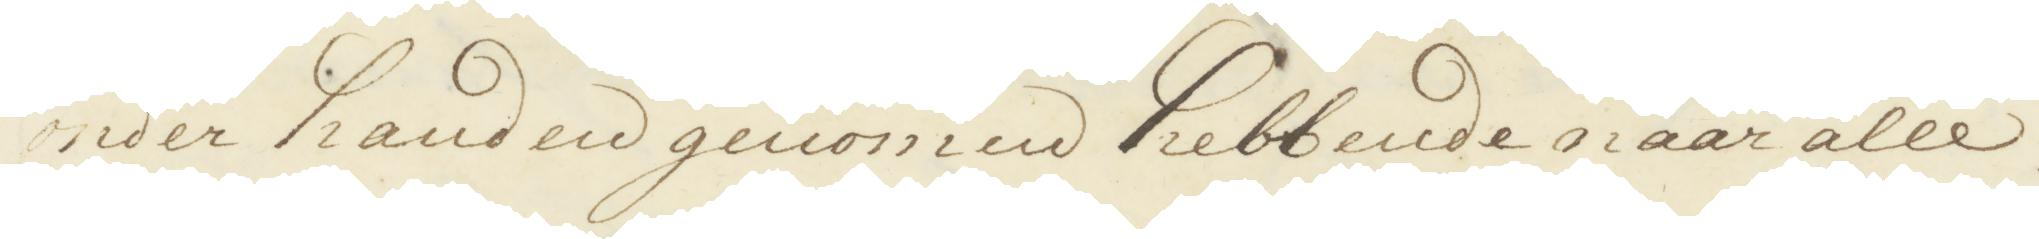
onder handen genomen hebbende naar alle
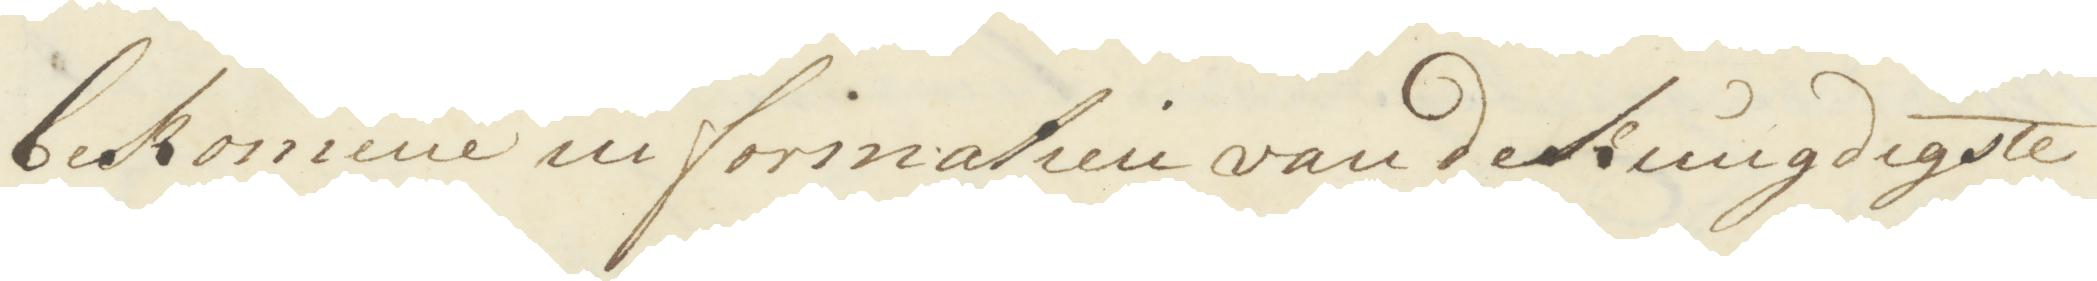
bekomene in formatien van de kungdigste
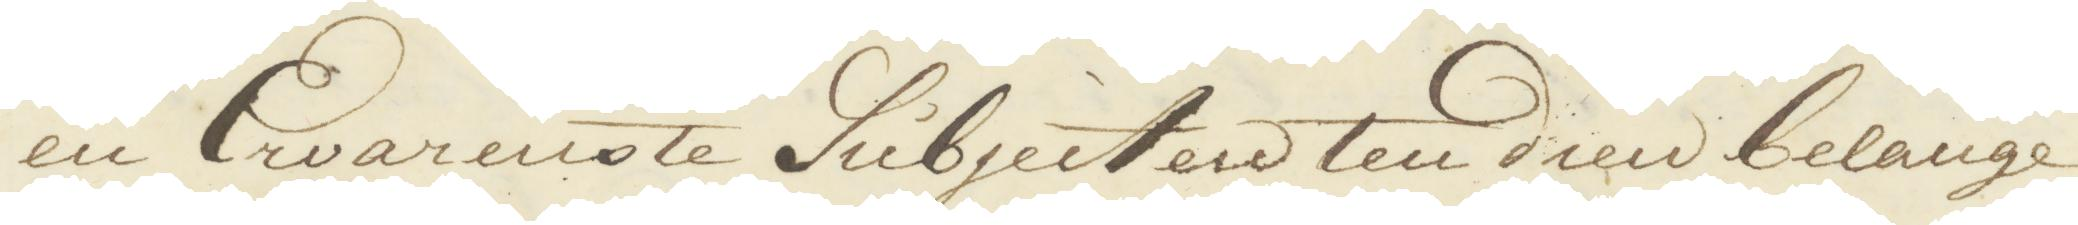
en Ervarenste subjecten ten dien belange
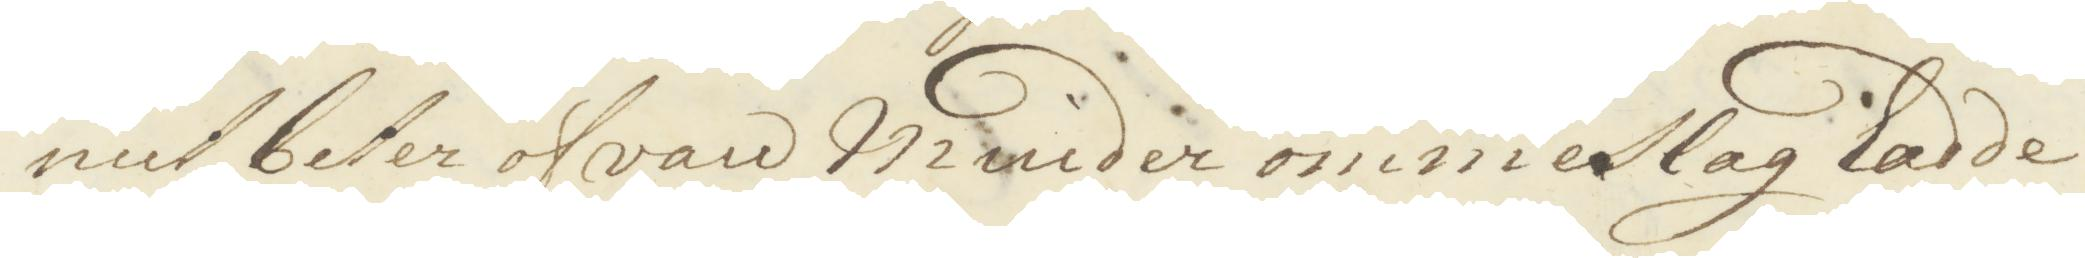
niet beter of van minder ommeslag hadde
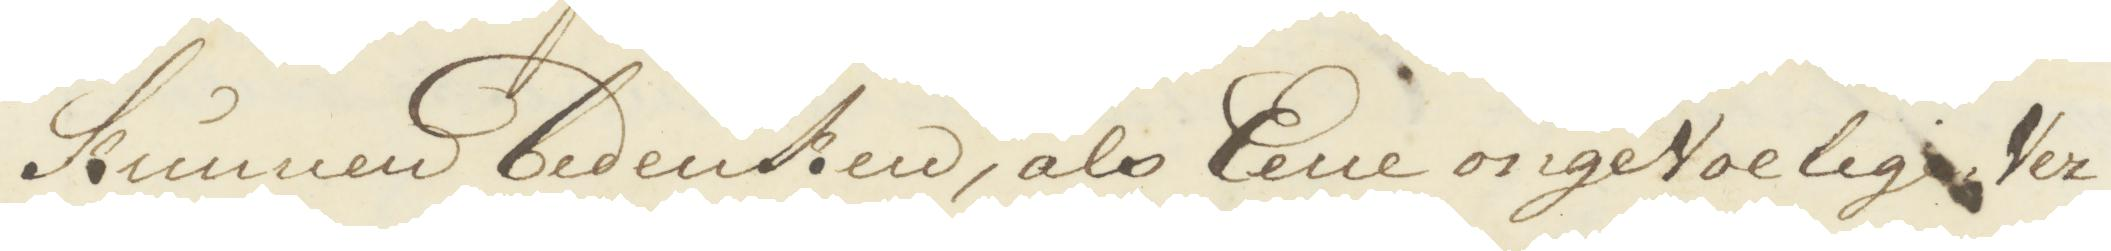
kunnen bedenken, als Eene ongevoelige ver
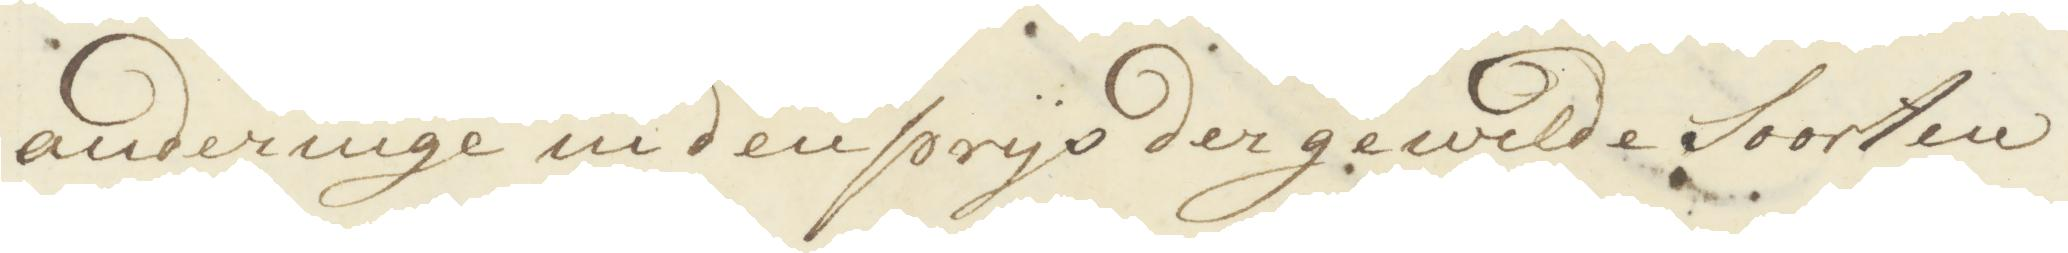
anderinge in den prijs der gewilde soorten
